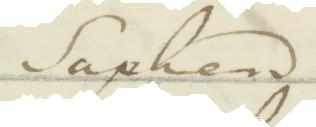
Saphen
